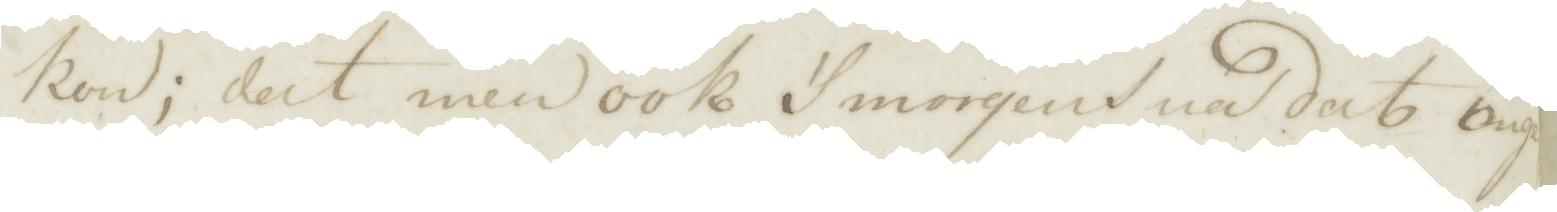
kon; dat men ook 'S morgens na dat onge
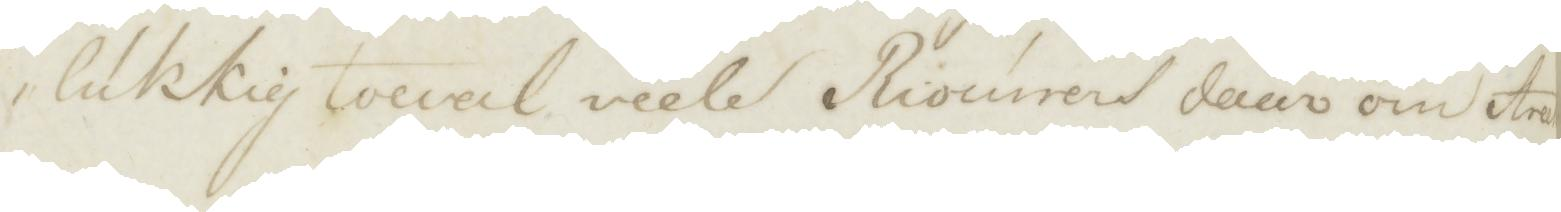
„lukkig toeval veele Riouwers daar om Ar
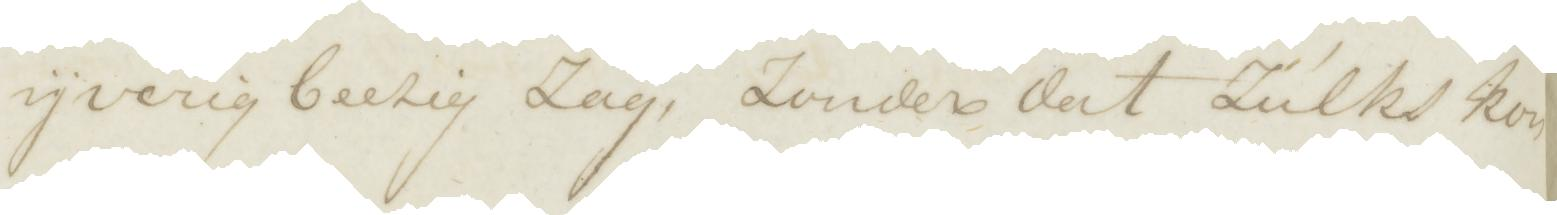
ijverig beezig Zag, Zonder dat Zulks kon
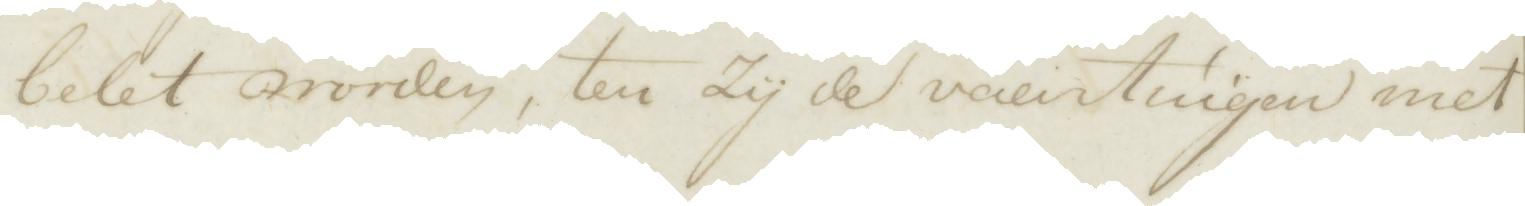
belet worden, ten Zij de vaartuigen met
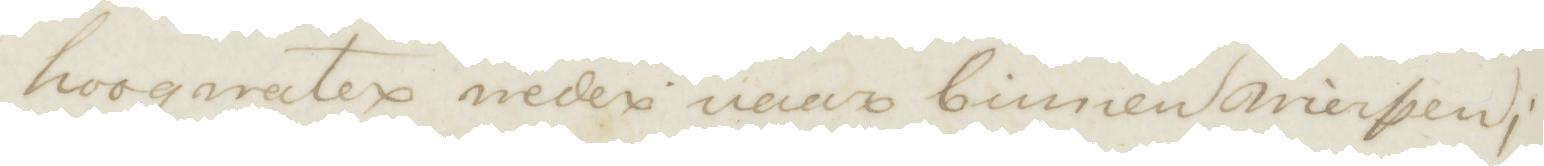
hoogwater weder naar binnen wierpen;
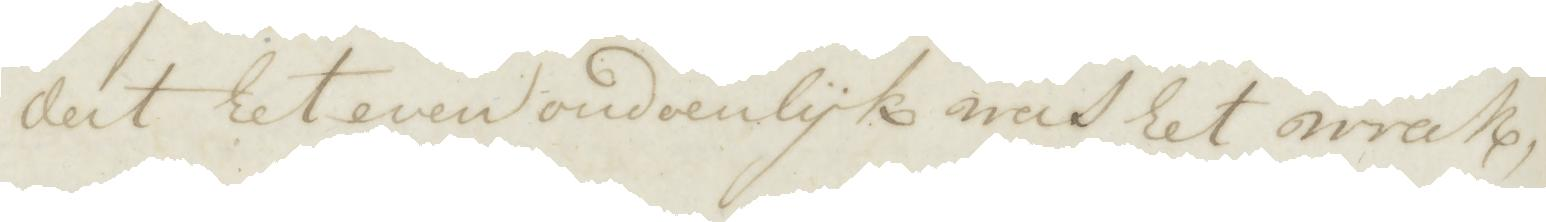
dat het even ondoenlijk was het wrak,
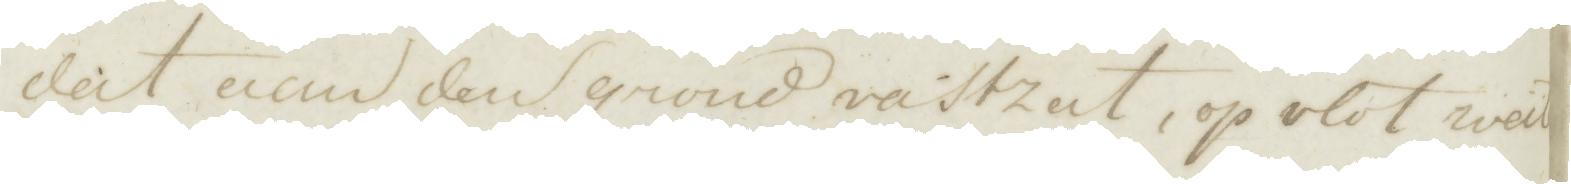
dat aan den grond vast zat, op vlot wat
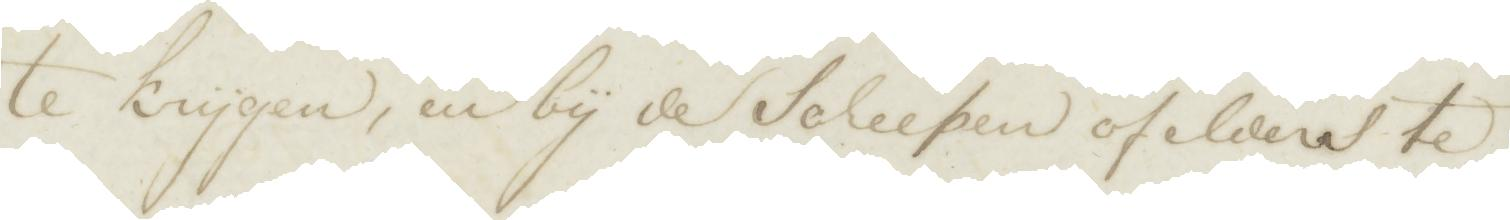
te krijgen, en bij de Scheepen of elders te
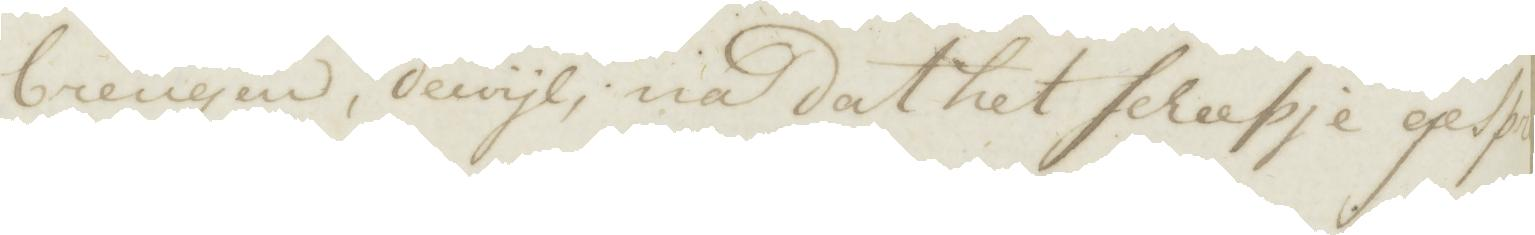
brengen, dewijl, na dat het scheepje gespr
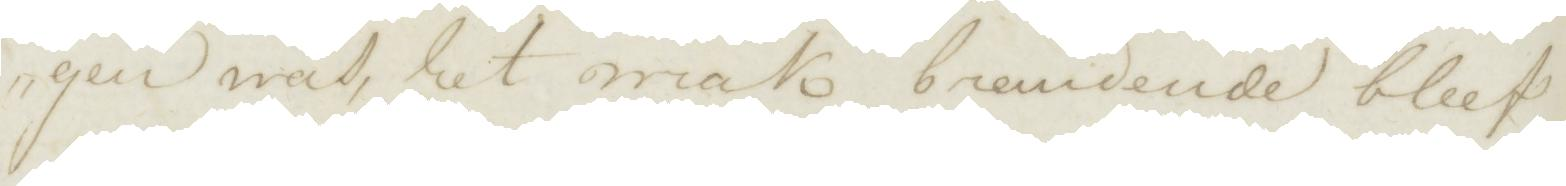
„gen was, het wrak brandende bleef
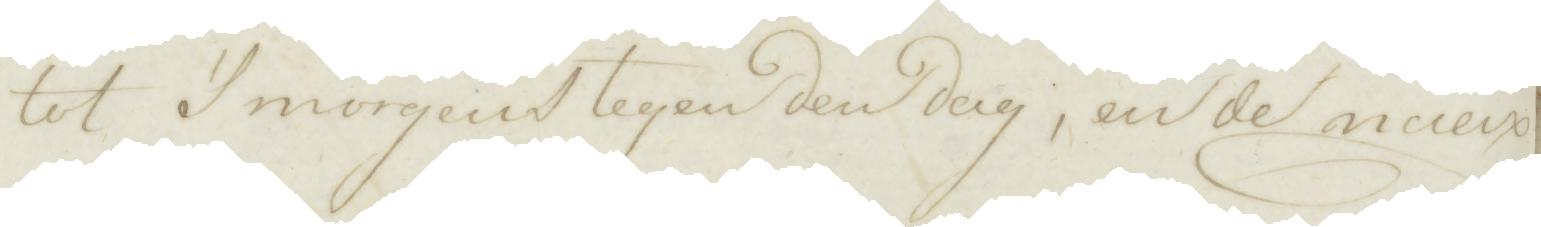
tot 'S morgens tegen den dag, en de naar
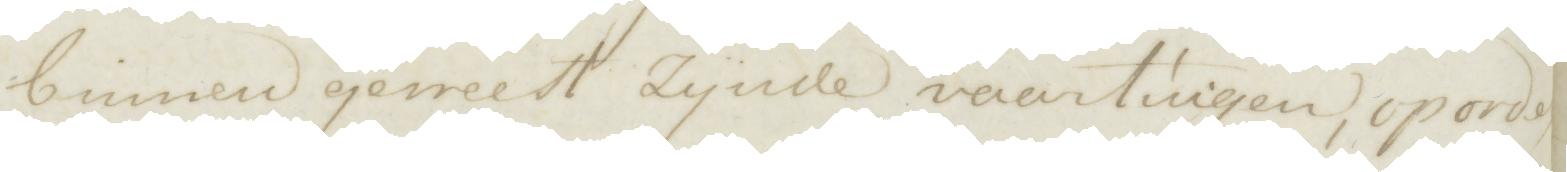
binnen geweest Zijnde vaartuigen, op orde
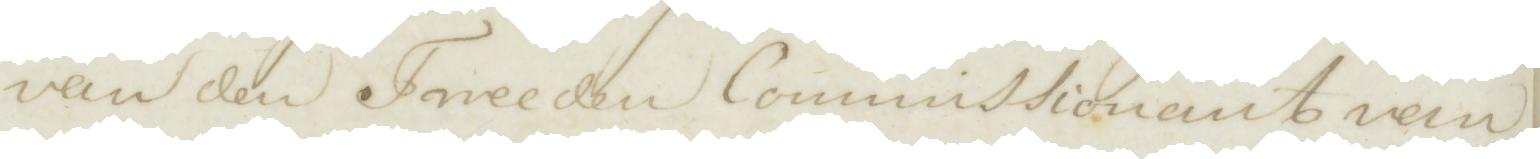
van den Tweeden Commissionant van
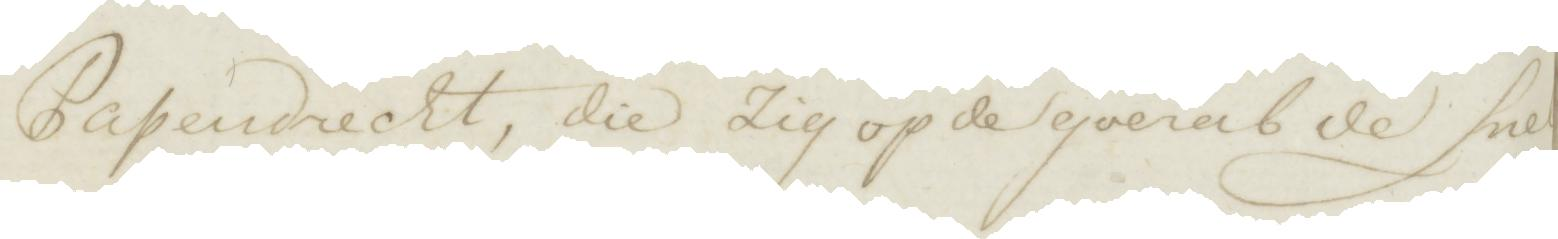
Papendrecht, die Zig op de goerab de Snel
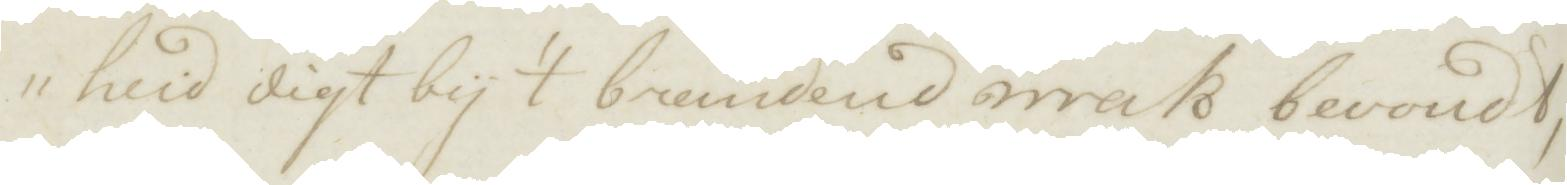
„heid digt bij ’t brandend wak bevondt,
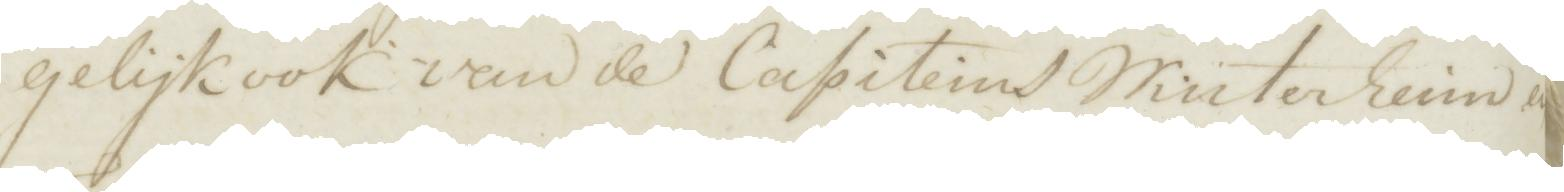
gelijk ook van de Capiteins Winterheim en
